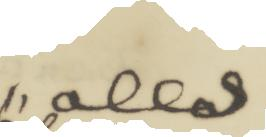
„alles
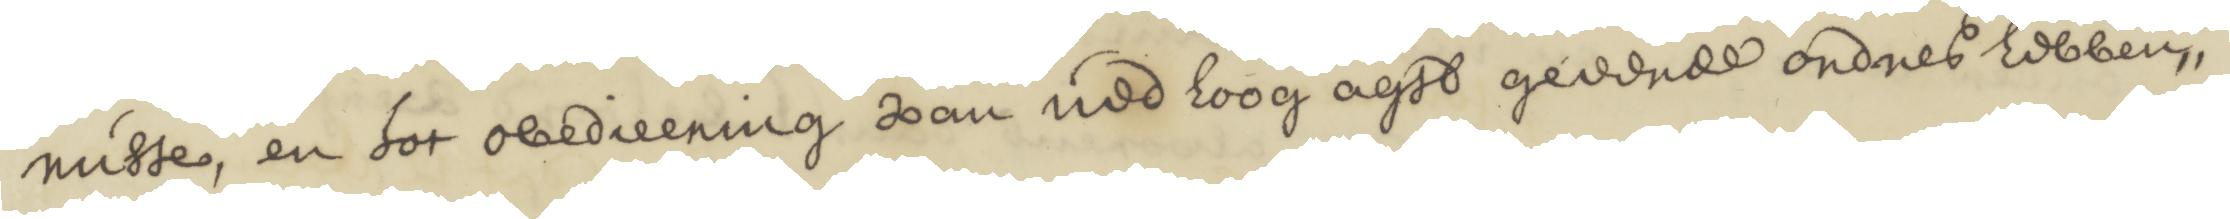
ruste, en tot obedieering van uEd hoog agtb geeerde ordres hebben„
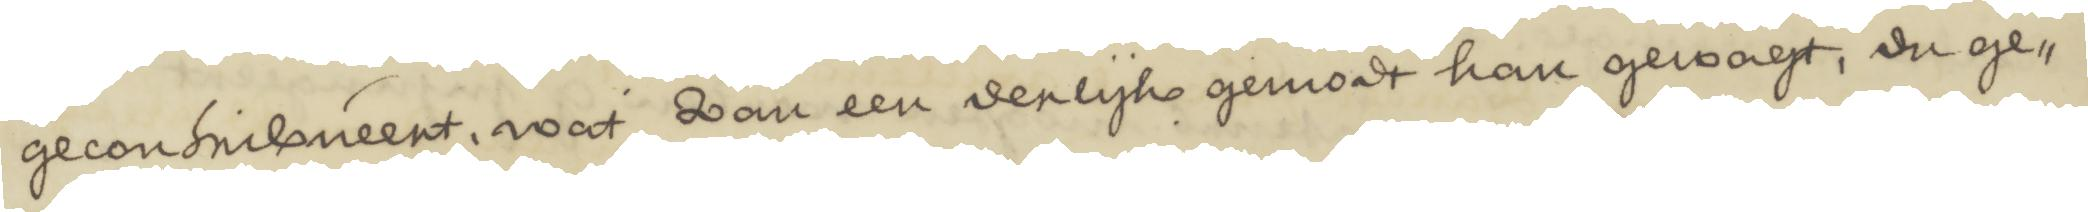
gecontribueert, wat van een eerlijk gemoet kan gewagt, en ge„
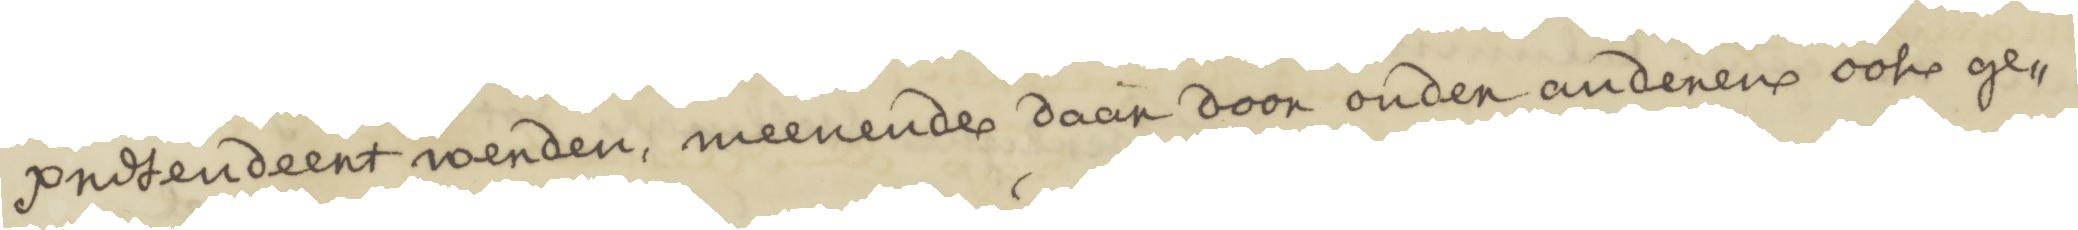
pretendeert werden, meenende daar door onder anderen ook ge„
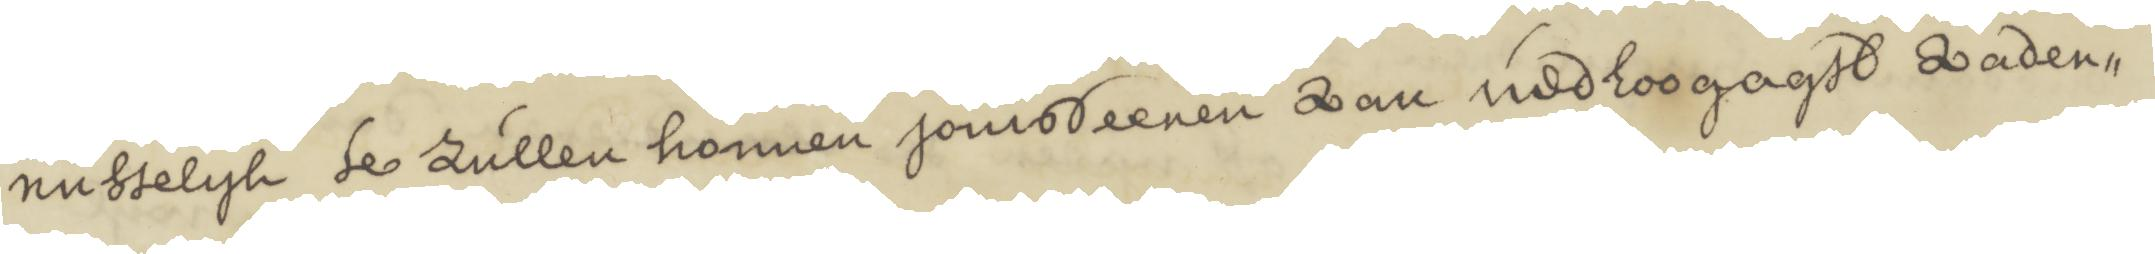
rustelijk te zullen konnen jouisseeren van u Ed hoog agtb vader„
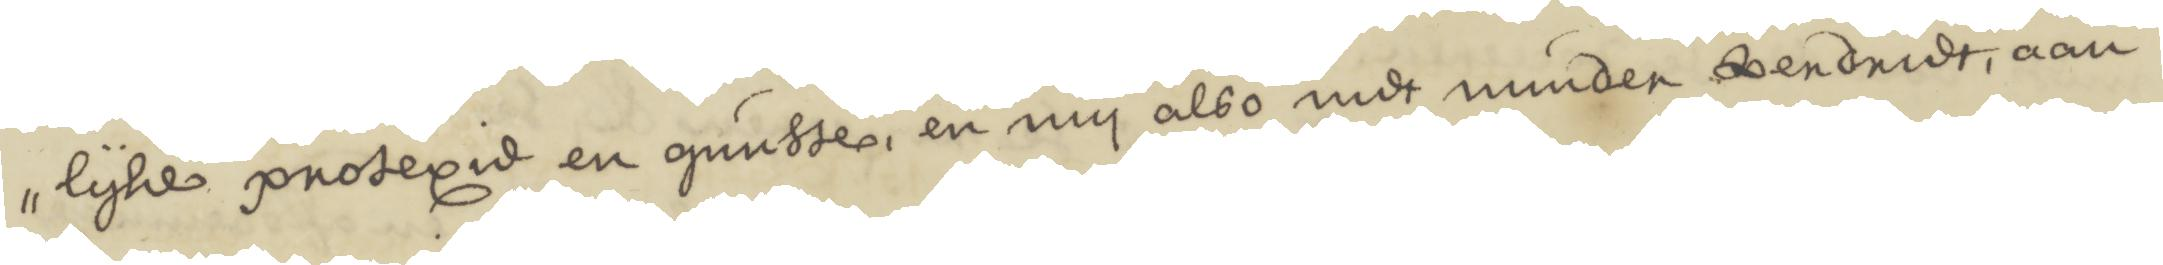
„lijke protexie en gunste, en mij also met minder verdriet, aan
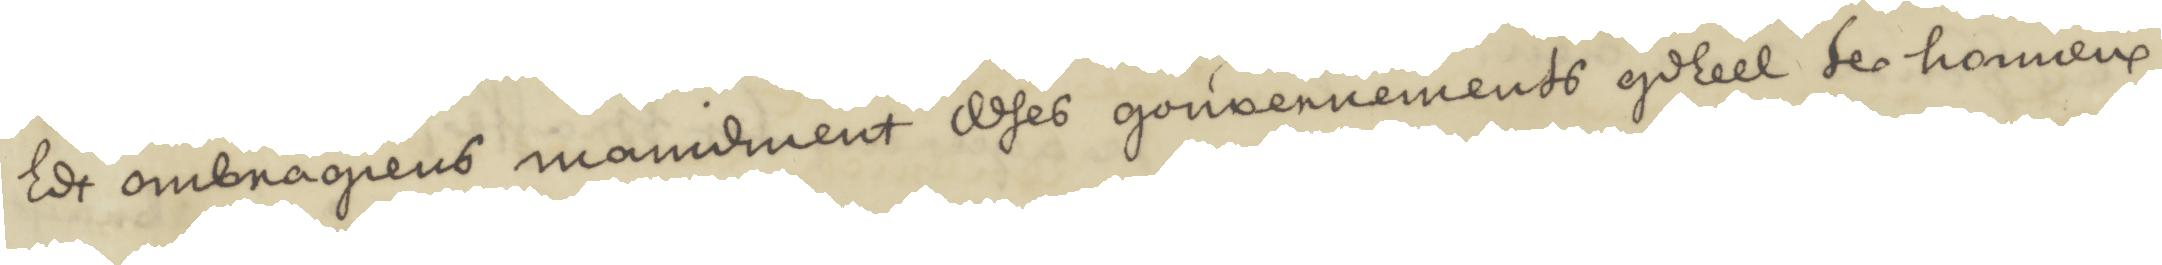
het ombragieus maniement deses gouvernements geheel te komen
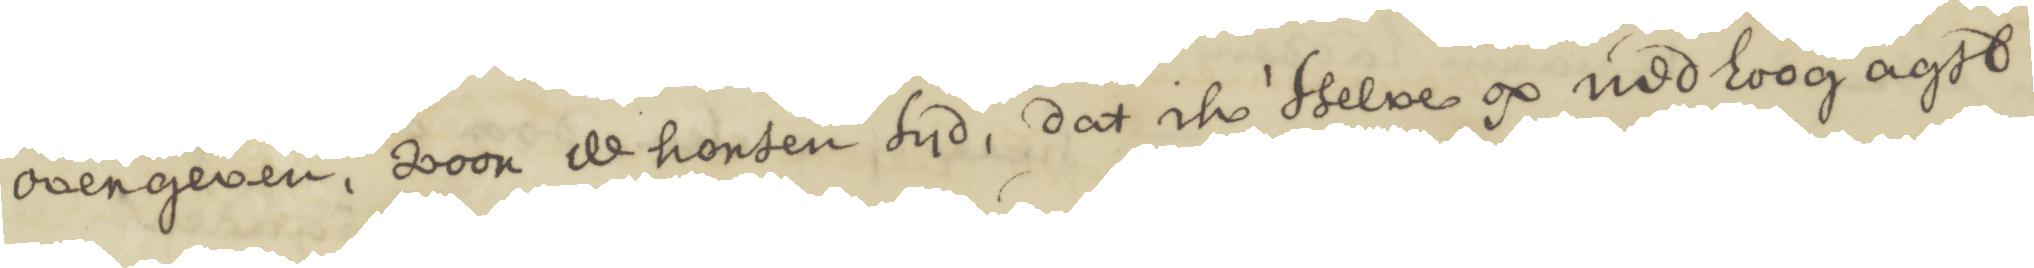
overgeven, voor de korten tyd, dat ik 'tselve op uEd hoog agtb
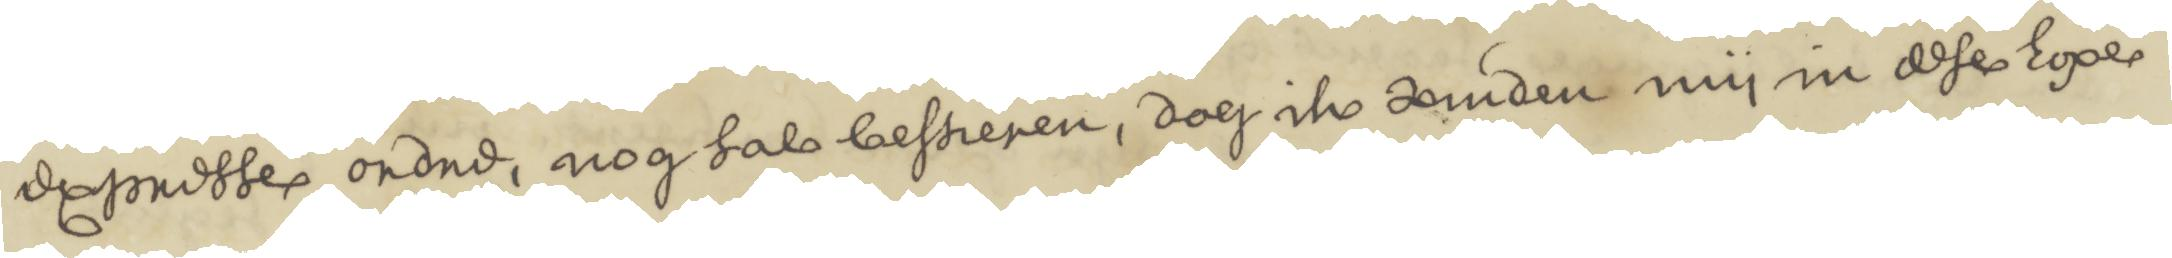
expresse ordre, nog sal bestieren, dog ik vinden mij in dese hope
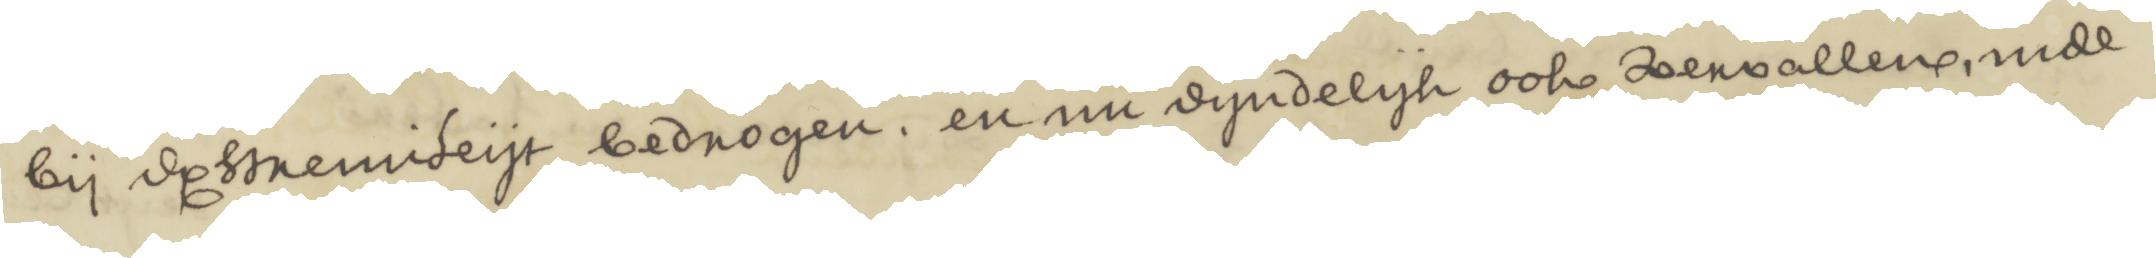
bij exstremiteijt bedrogen, en nu eijndelijk ook vervallen, inde
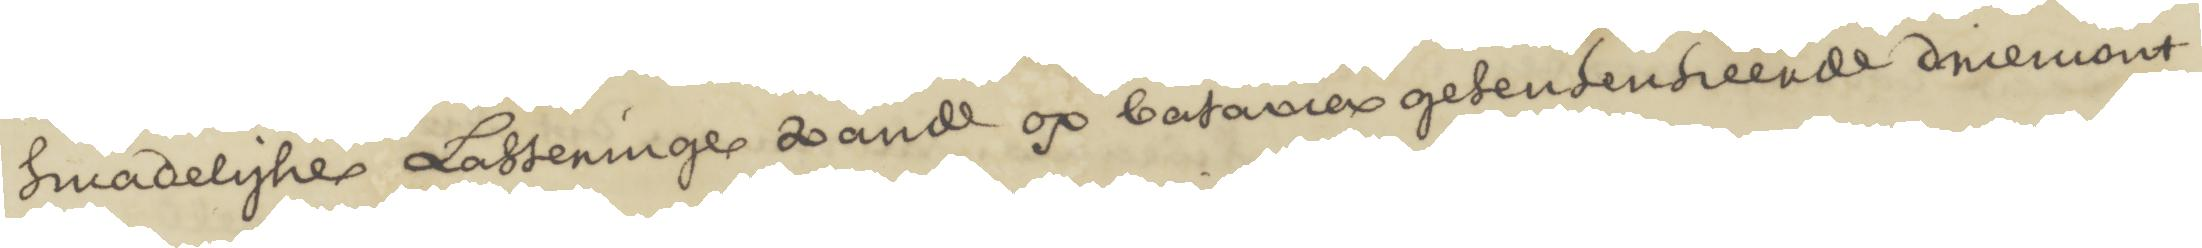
smadelijke Lasteringe vande op batavia gesententieerde driemont
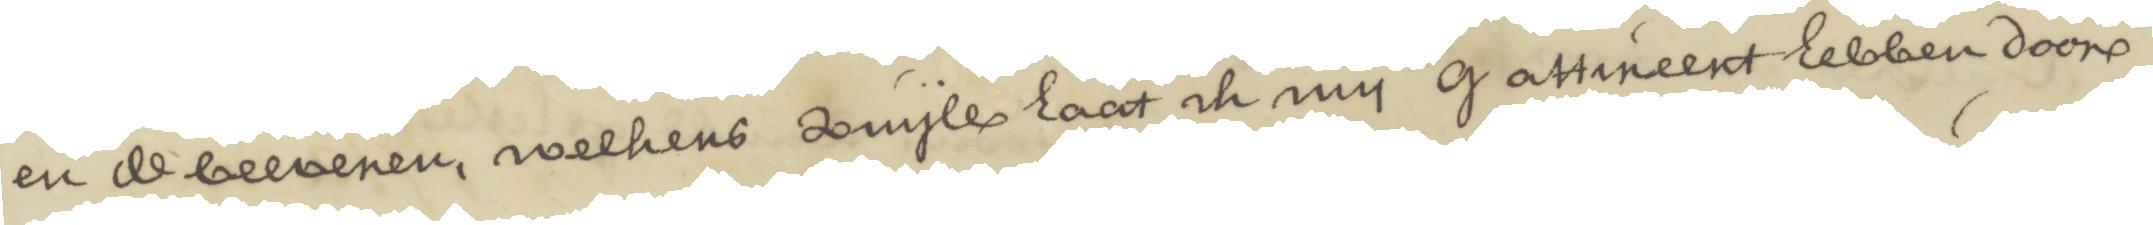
en de beeveren, welkers vuijle haat ik mij g attireert hebben door
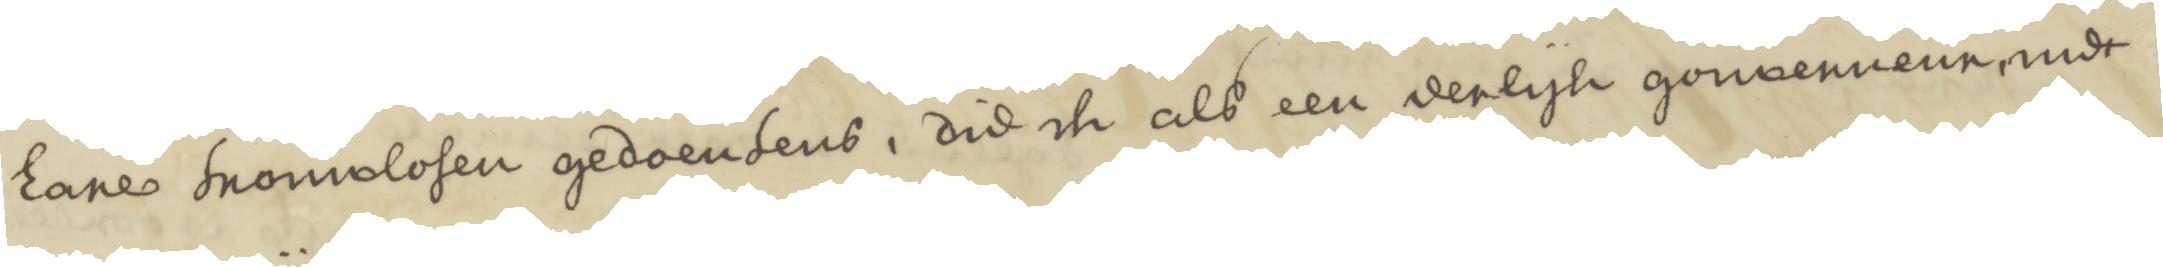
hare trouwlosen gedoentens, die ik als een eerlijk gouverneur, met
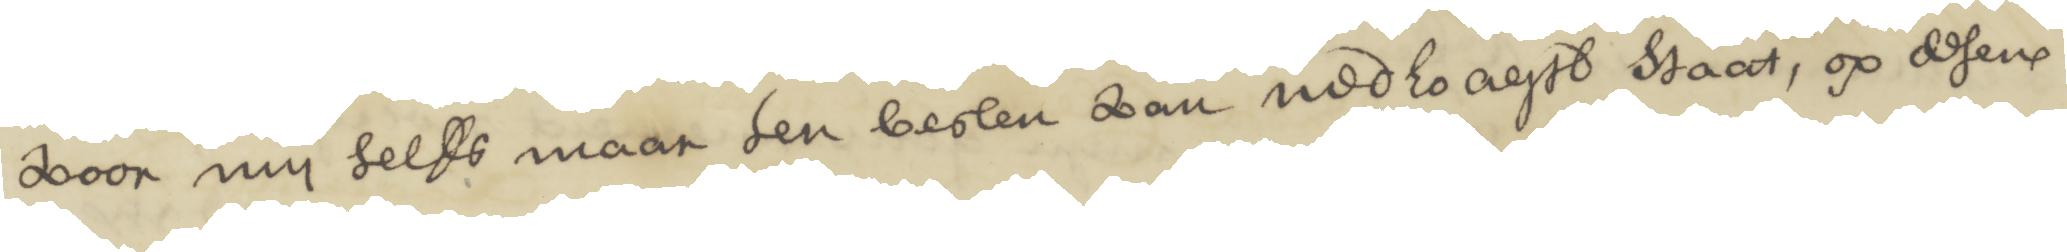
voor mij selfs maar ten besten van ued ho agtb staat, op desen
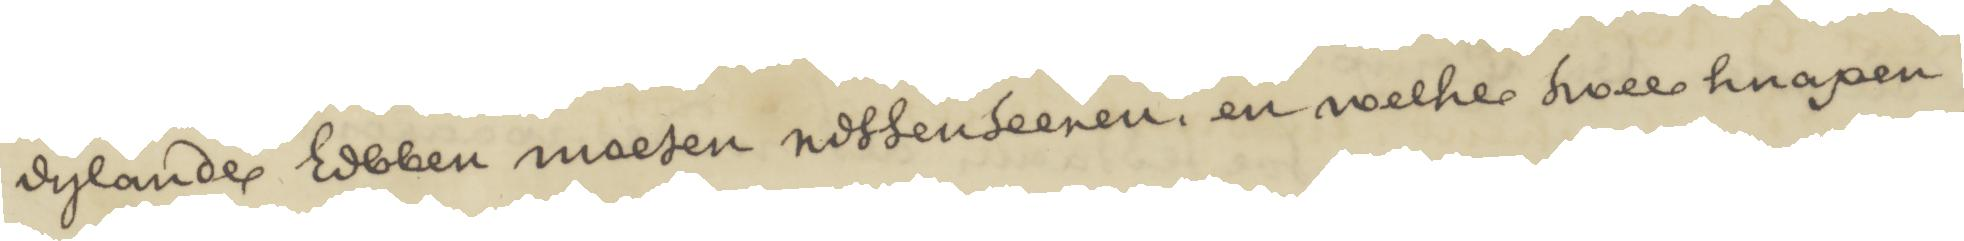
ejlande hebben moeten ressenteeren, en welke twee knapen
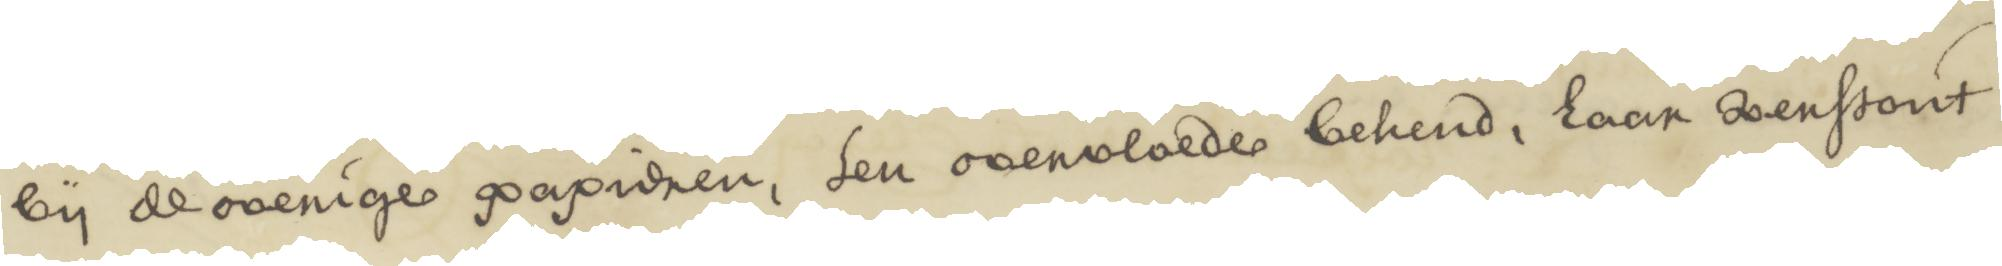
bij de overige papieren, ten overvloede bekend, haar verstout
